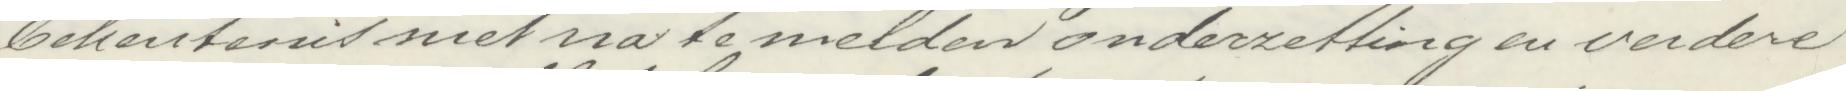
bekentenis met na te melden onderzetting en verdere
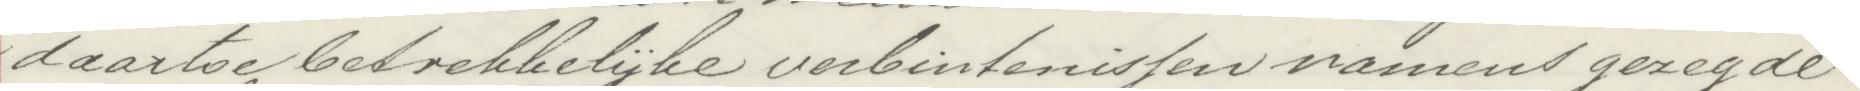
daartoe betrekkelijke verbintenissen namens gezegde
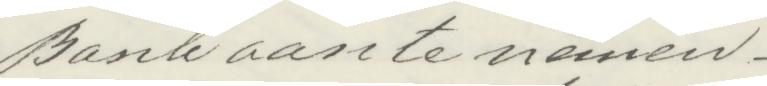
Bank aan te nemen
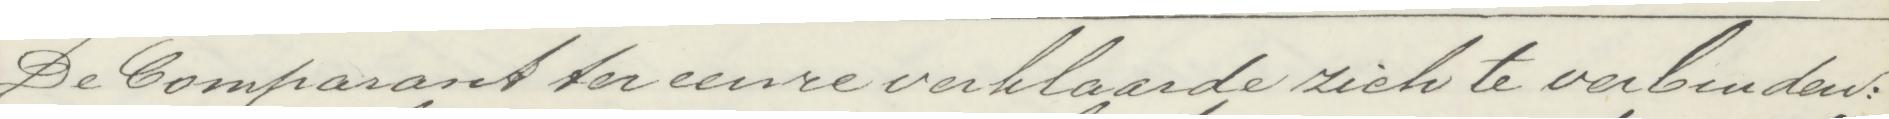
De Comparant ter eenre verklaarde zich te verbinden:
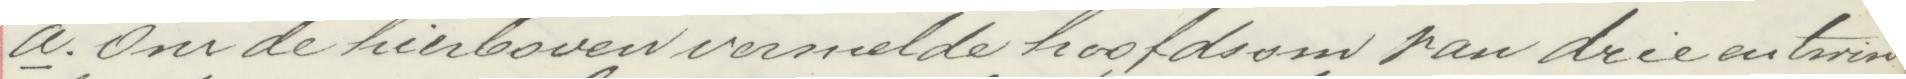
a. Om de hierboven vermelde hoofdsom van drie en twin
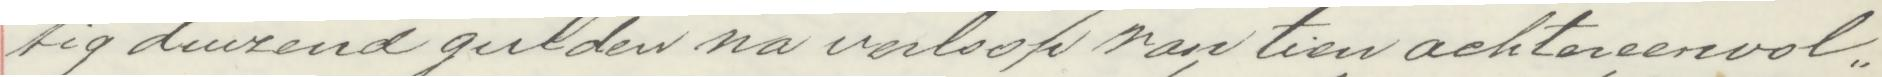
tig duizend gulden na verloop van tien achtereenvol„
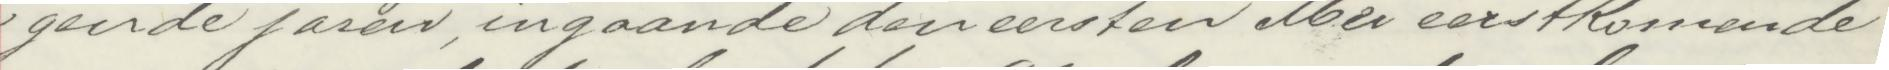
gende jaren, ingaande den eersten Mei eerstkomende
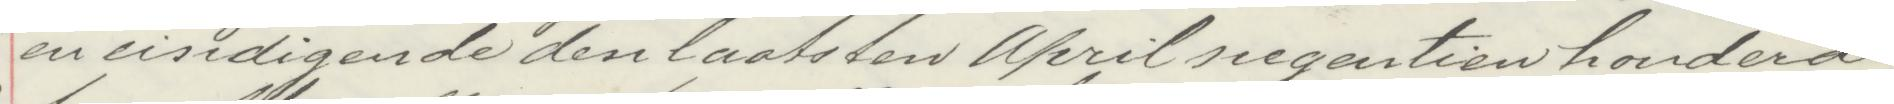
en eindigende den laatsten April negentien honderd
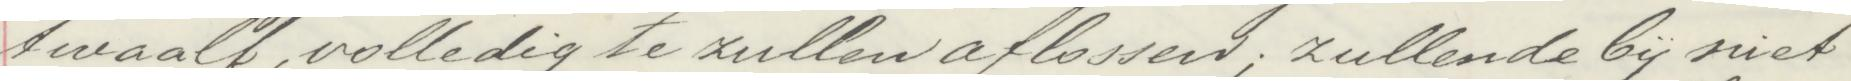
twaalf, volledig te zullen aflossen; zullende bij niet
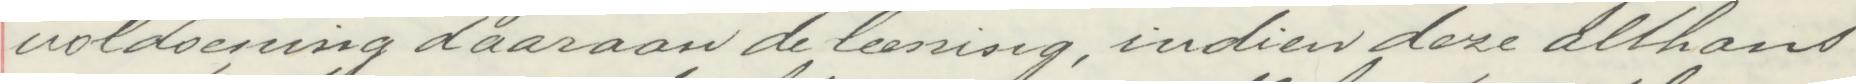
voldoening daaraan de leening, indien deze althans
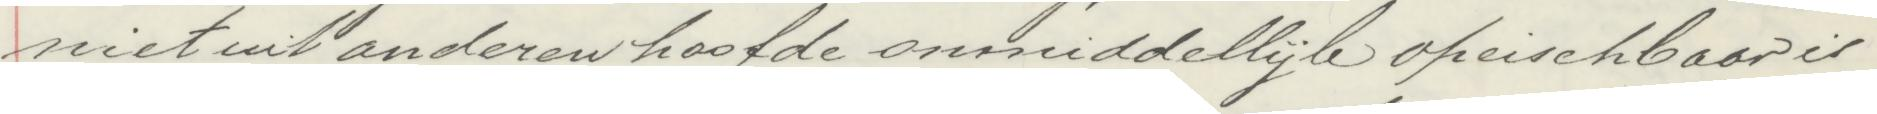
niet uit anderen hoofde onmiddellijk opeischbaar is
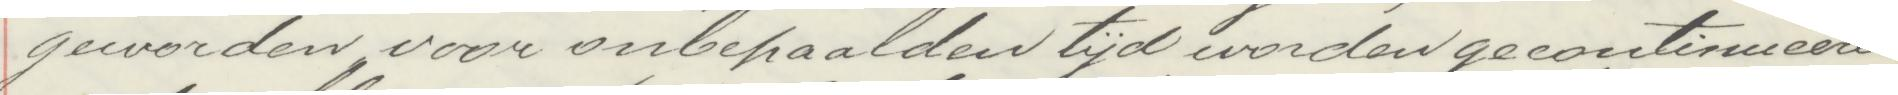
geworden, voor onbepaalden tijd worden gecontinueerd
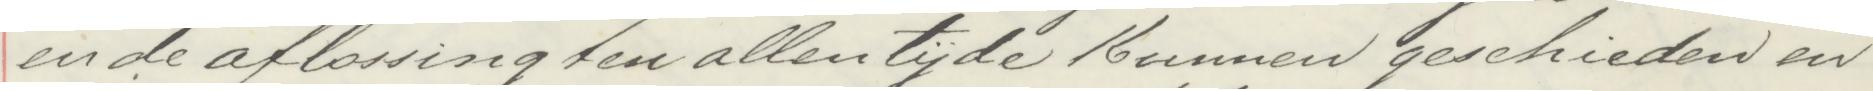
en de aflossing ten allen tijde kunnen geschieden en
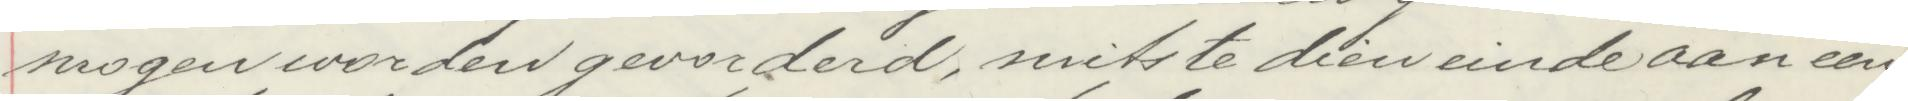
mogen worden gevorderd, mits te dien einde aan een
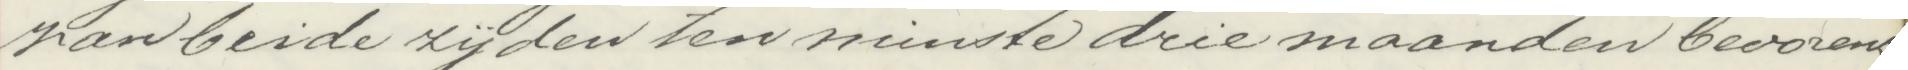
van beide zijden ten minste drie maanden bevorens
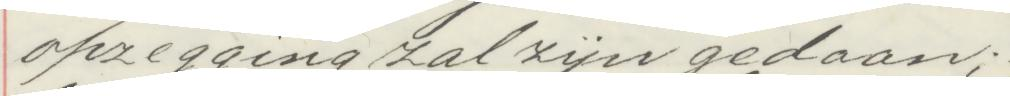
opzegging zal zijn gedaan;
